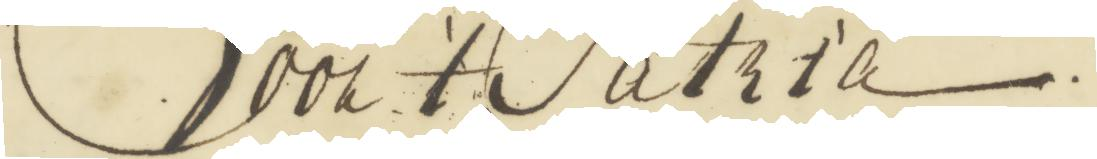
Voor ’t Patria.
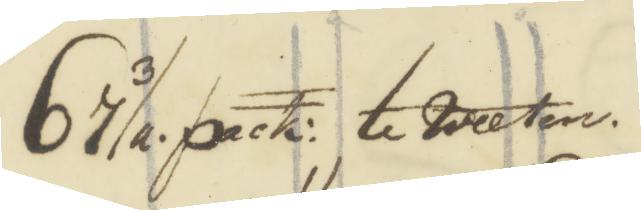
67 3/4. pack: te weeten.
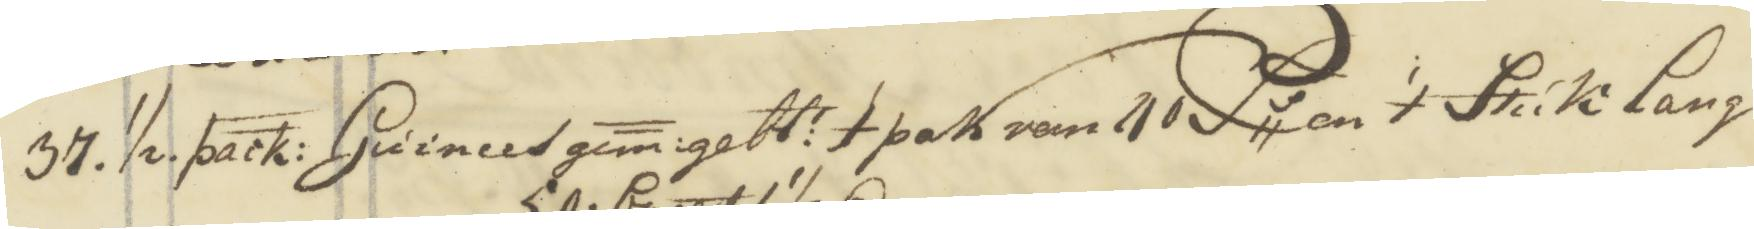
37. ½. pack: Guinees gem: gebt:t 't pak van 40 P„s en ’t stuk lang
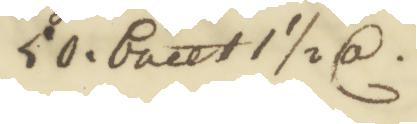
50. breet 1½ @.
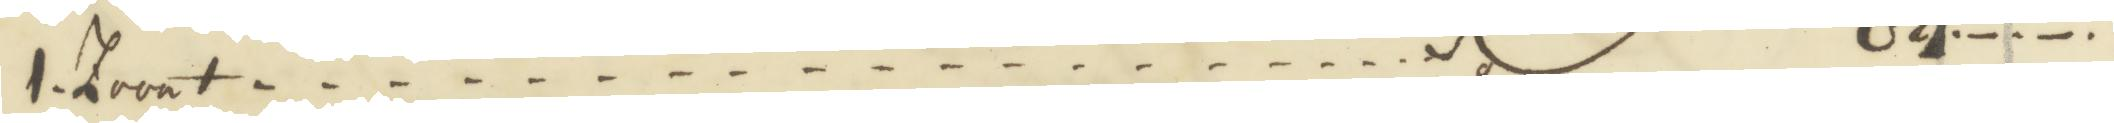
1. Zoort - - - - - - - - - - - - - - - - - - - R„a 84.—.—.
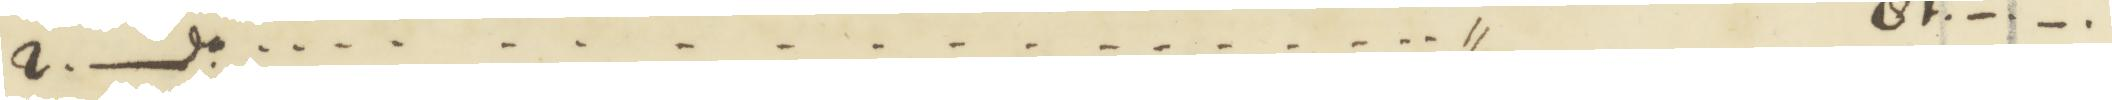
2. _:o - - - - - - - - - - - - - - - - - - „ 81.—.—.
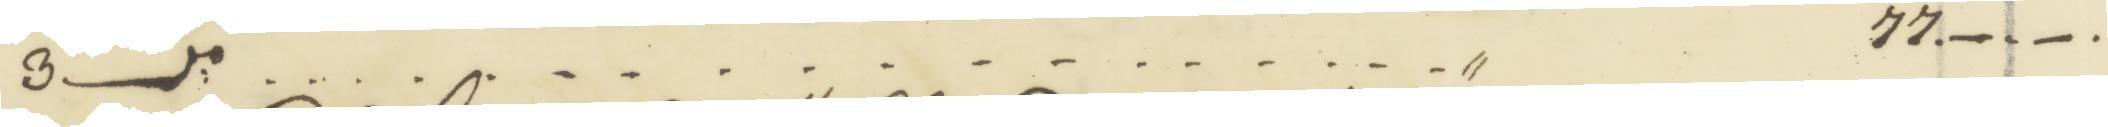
3. _:o - - - - - - - - - - - - - - - - - - „ 77. —. —.
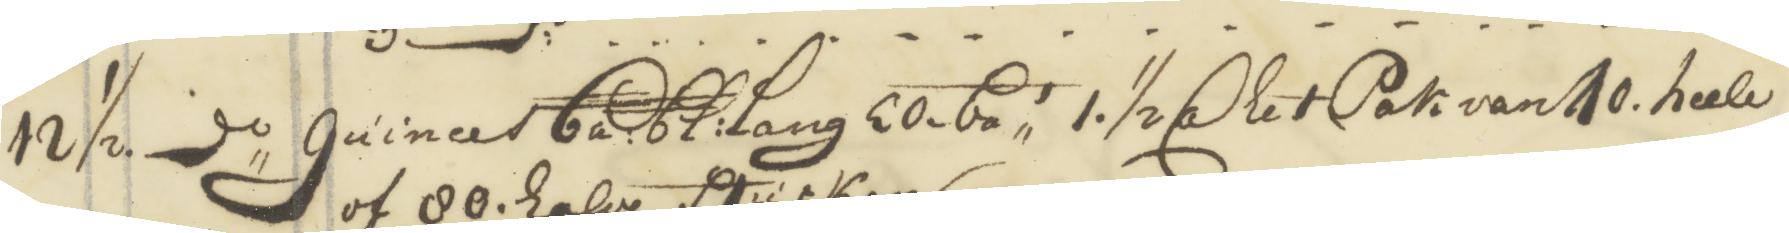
12 ½. d„o guinees br: bl: lang 50. br„t 1. ½ @ het Pak van 40. heele
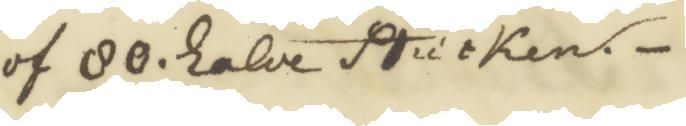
of 80. halve stucken. —
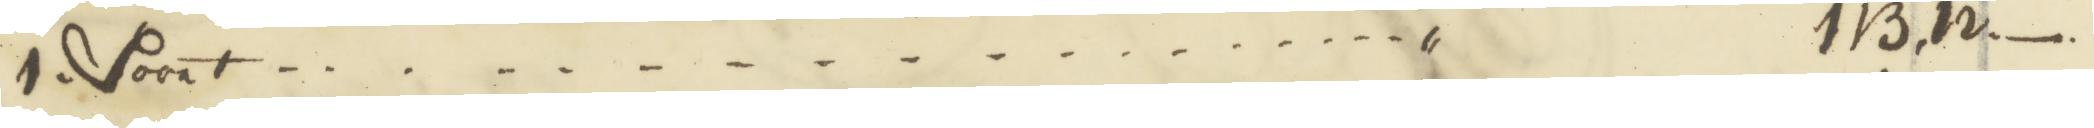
1. Zoort - - - - - - - - - - - - - - - - - - „ 113.12.—.
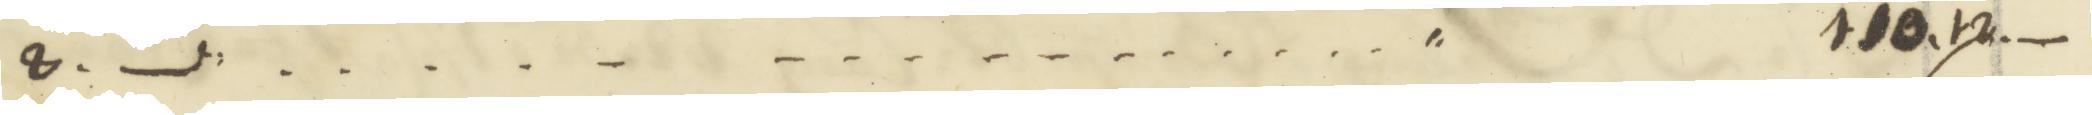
2. _:o - - - - - - - - - - - - - - - - „ 110.12. —
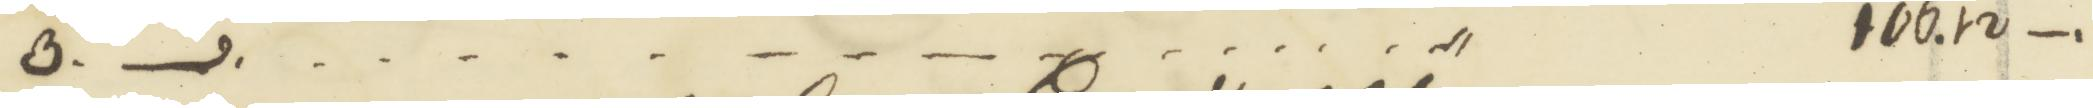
3. _:o - - - - - - - - - - - - - - „ 106.12 —.
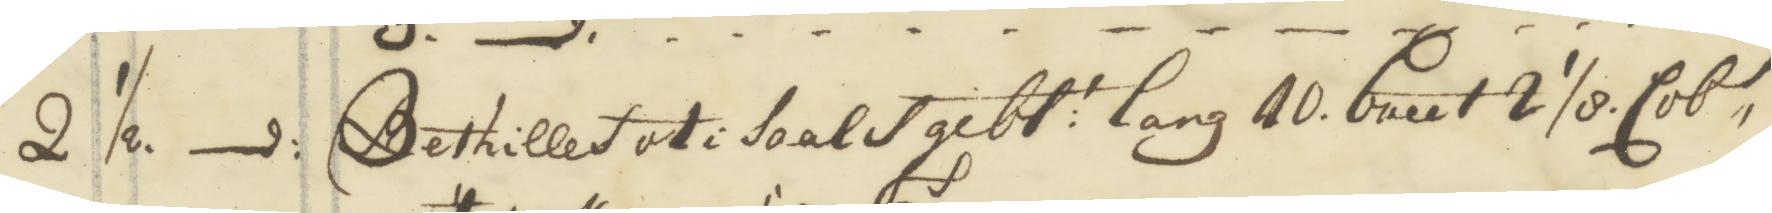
2 ½. _:o Bethilles oti saels gebt:t lang 40. breet 2 1/8. Cob„s
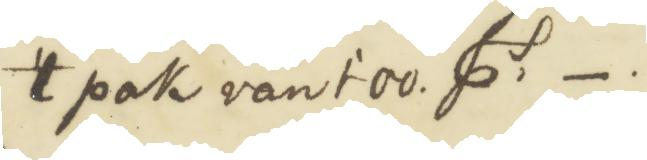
't pak van 100. p„s —.
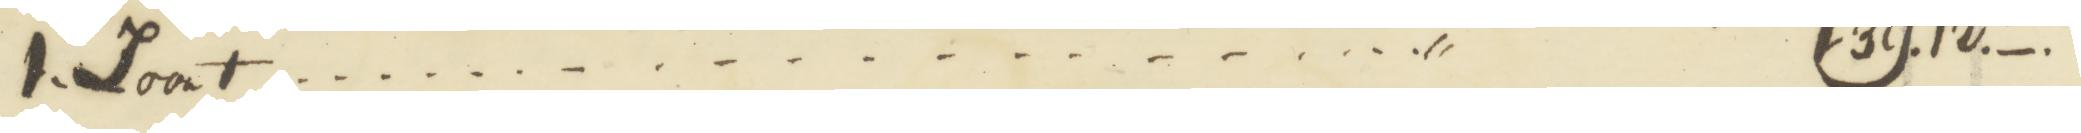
1. Zoort „ - - - - - - - - - - - - - - - - - - - 139.12.—.
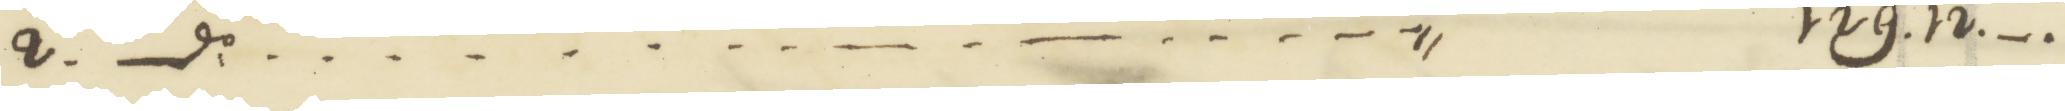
2. _:o - - - - - - - - - - - - - - - - - - „ 129.12.—.
